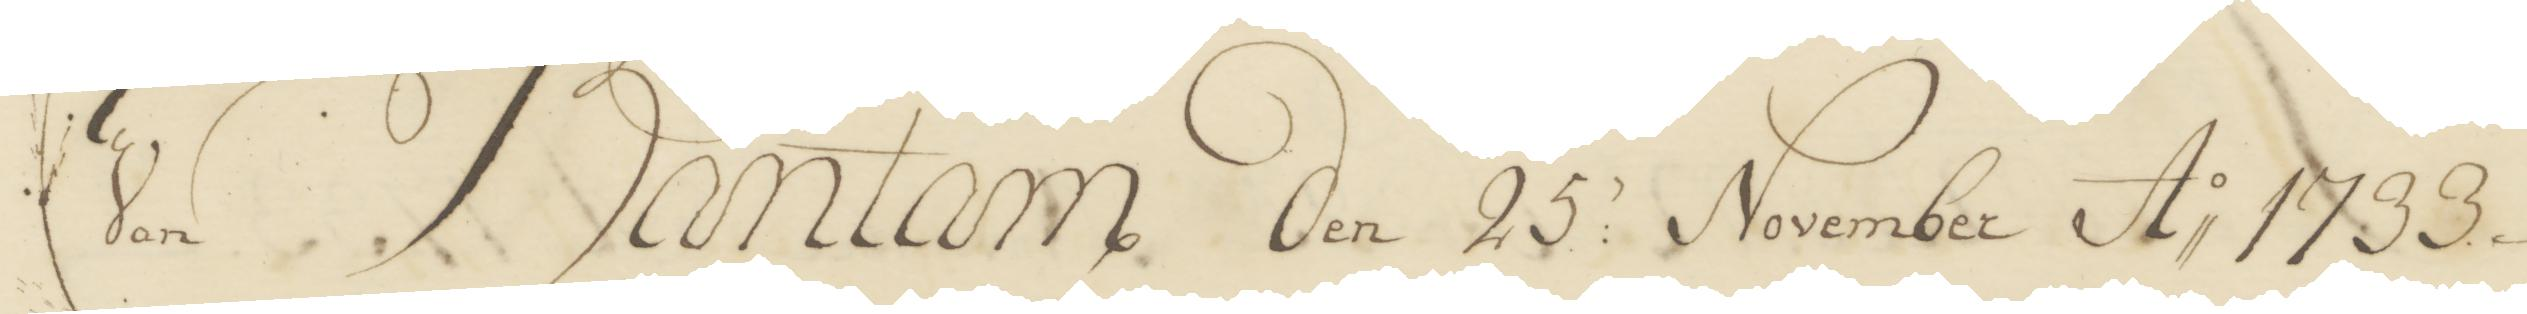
Van Bantam den 25:' November A„o 1733.
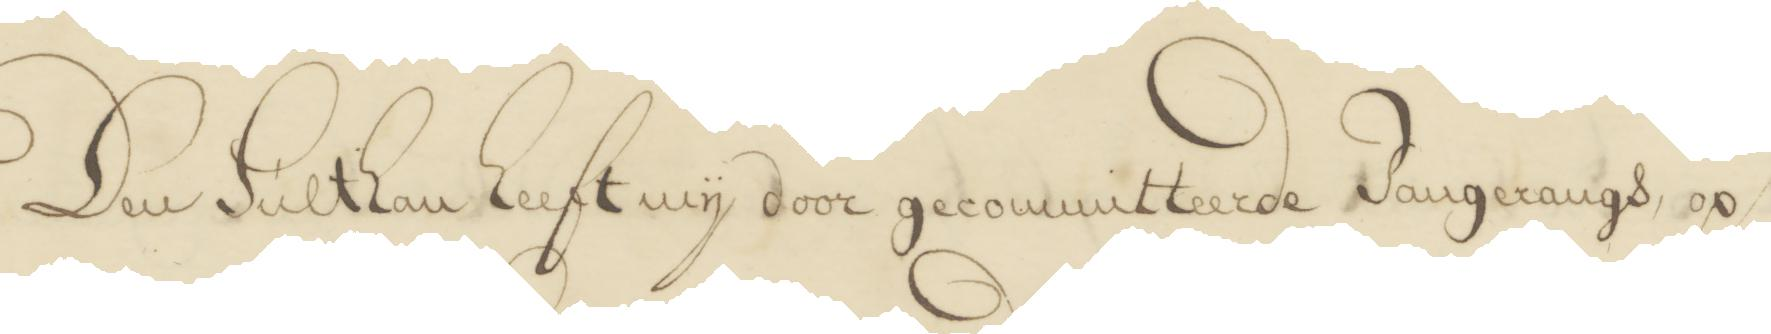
Den sulthan heeft mij door gecommitteerde pangerangs, op
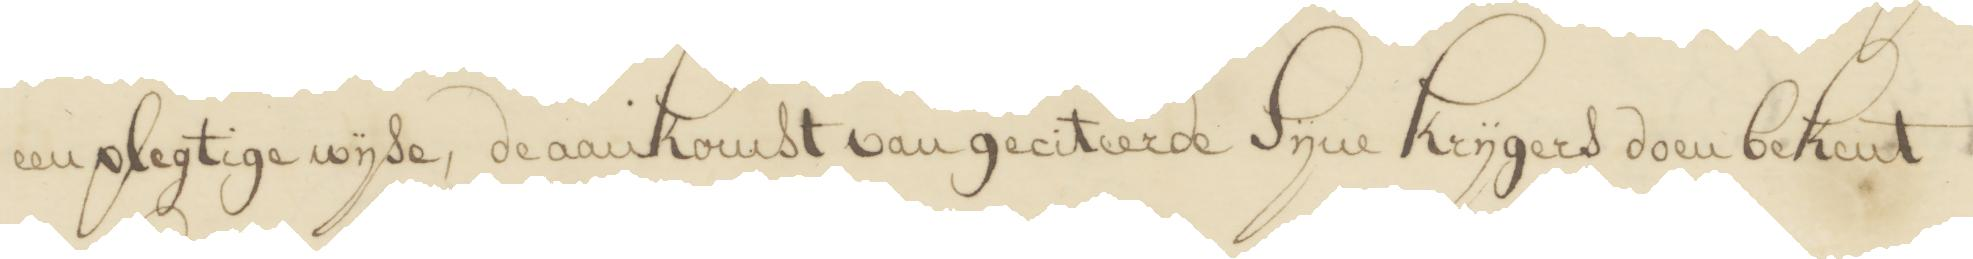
een plegtige wijse, de aankomst van geciteerde sijne krijgers doen bekent
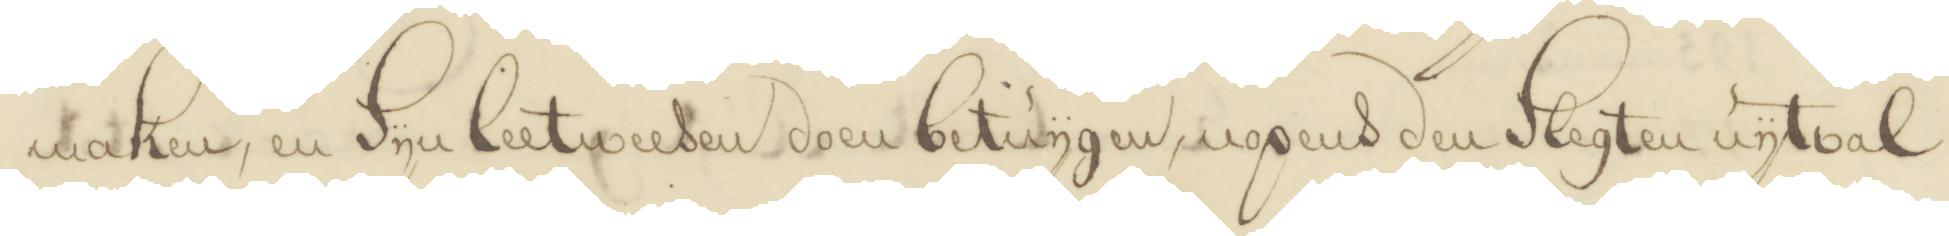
maken, en sijn leetweesen doen betuijgen, nopens den slegten uijtval
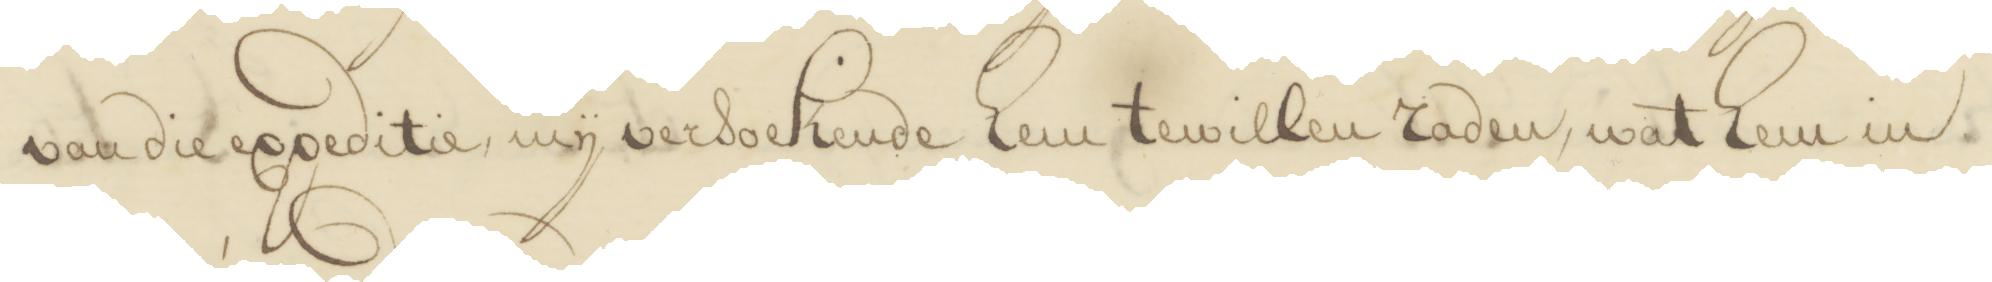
van die expeditie, mij versoekende hem tewillen raden, wat hem in
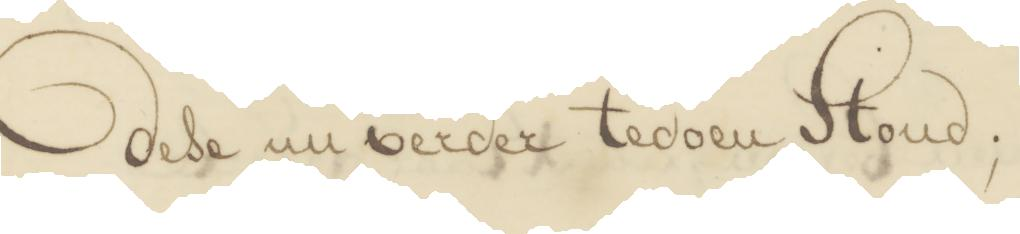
dese nu verder tedoen Stond;
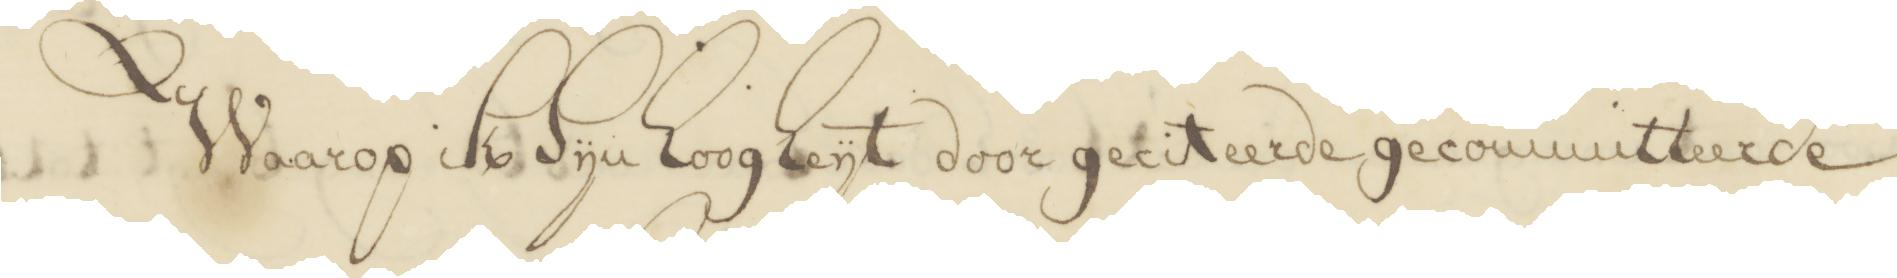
Waarop ik Sijn hoogheijt door geciteerde gecommitteerde
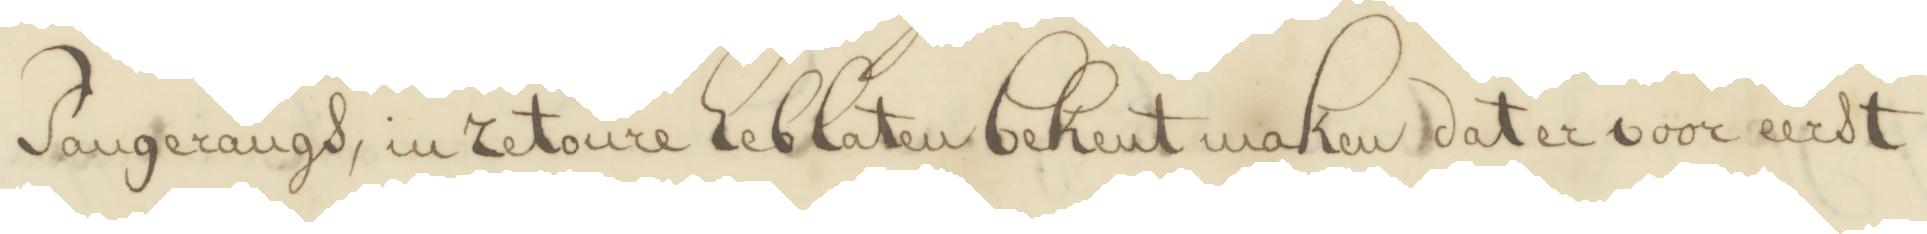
Pangerangs, in retoure heb laten bekent maken dat er voor eerst
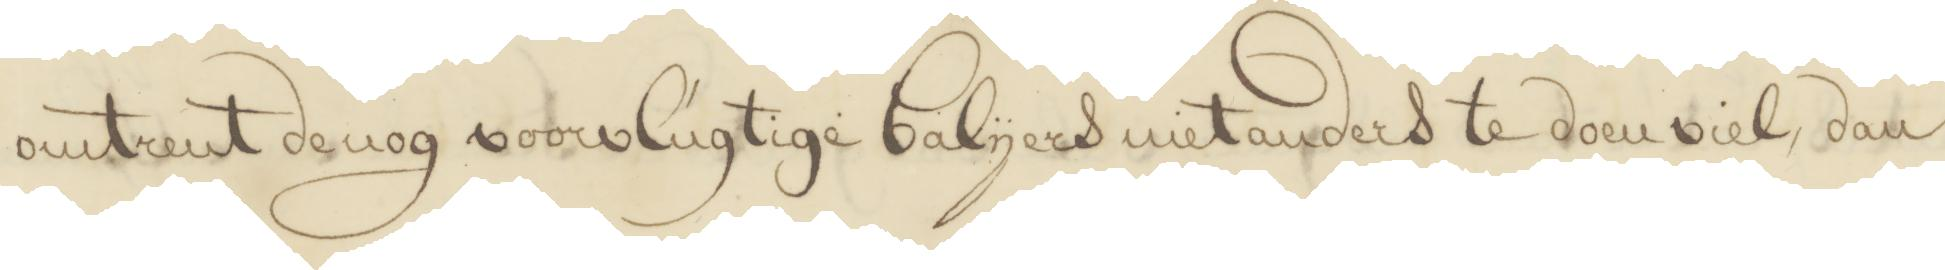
omtrent de nog voorvlugtige balijers niet anders te doen viel, dan
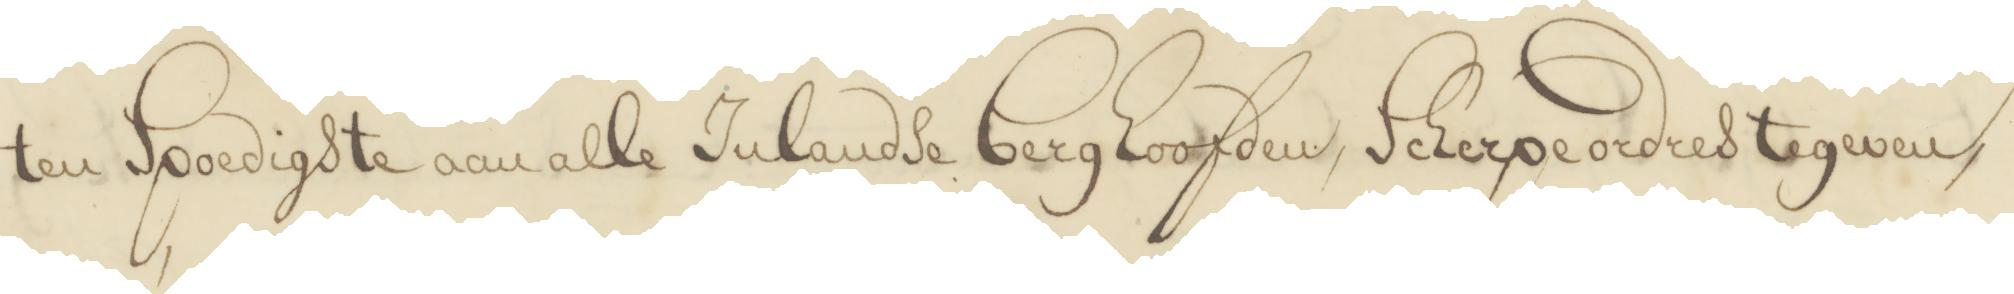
ten spoedigste aan alle Inlandse berghoofden, scherpe ordres te geven,
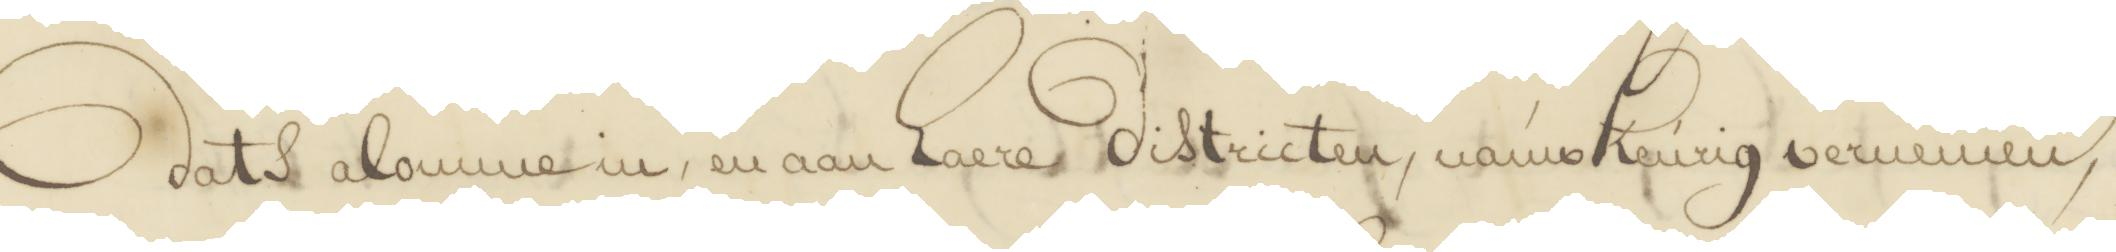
dat s' alomme in, en aan haere districten, nauwkeurig vernemen,
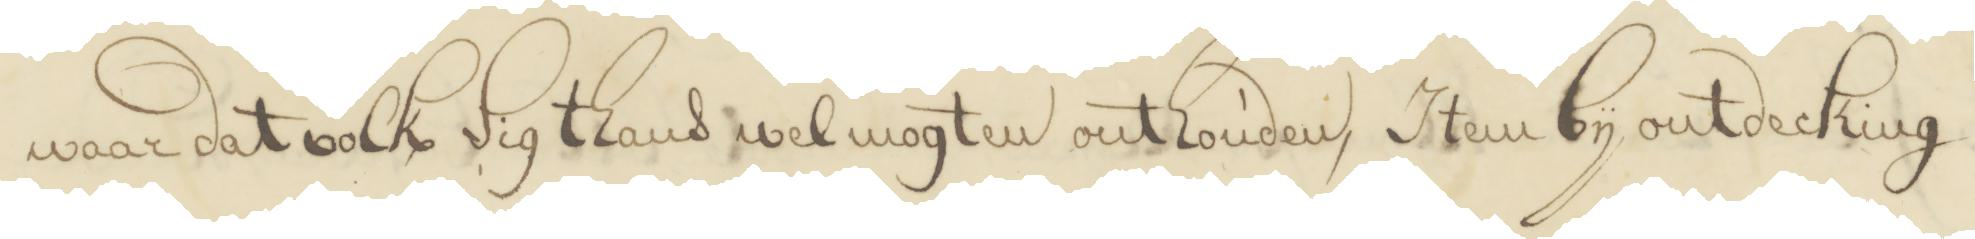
waar dat volk sig thans wel mogten onthouden, Item bij ontdecking
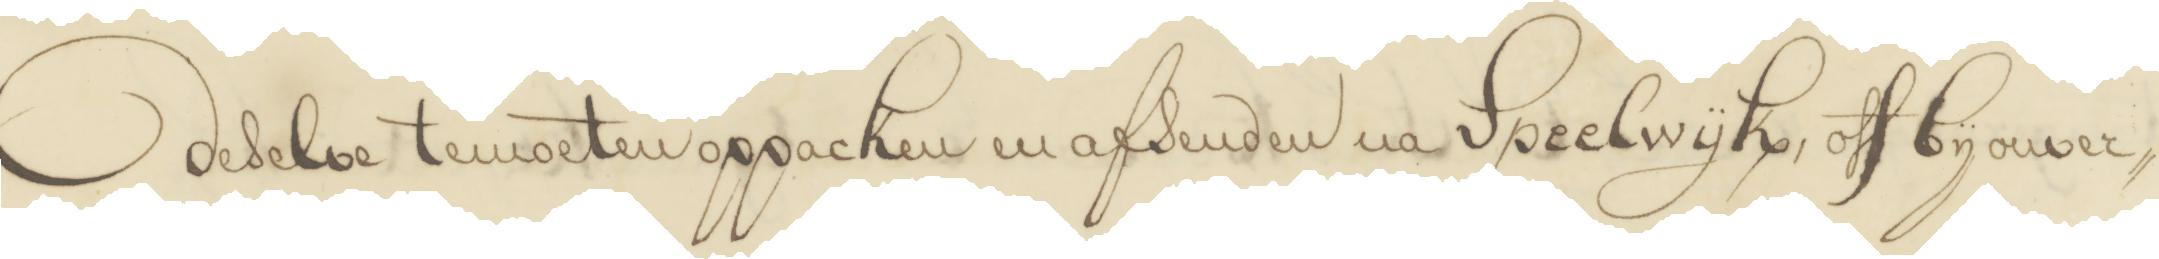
deselve te moeten oppacken en afsenden na Speelwijk, off bij onver„
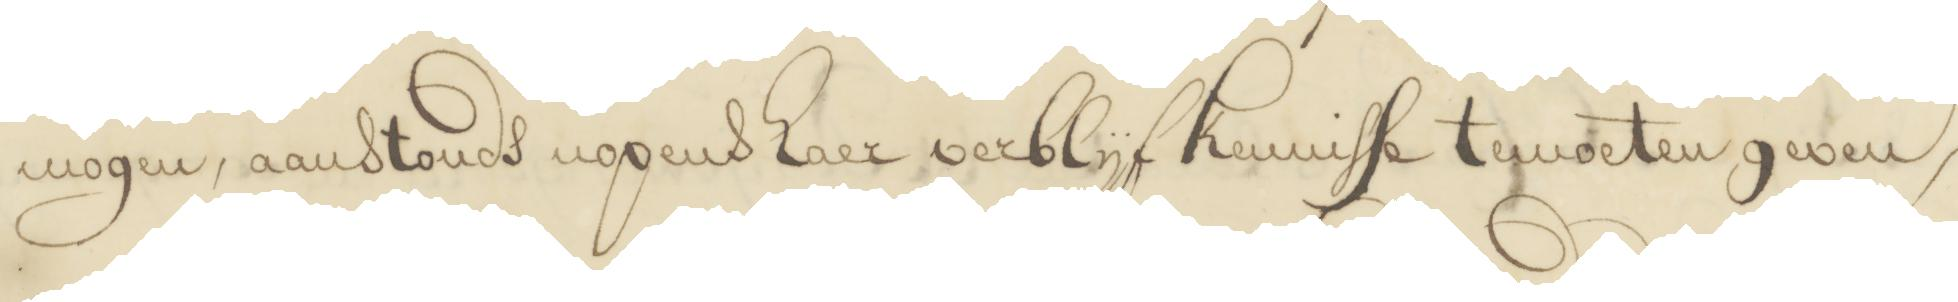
mogen, aanstonds nopens haer verblijf kennisse te moeten geven,
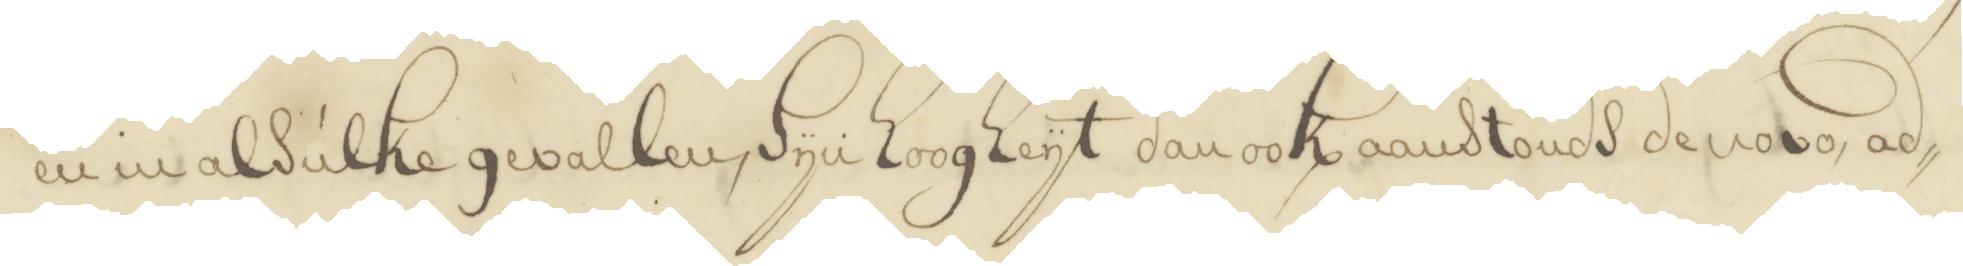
en in alsulke gevallen, Sijn hoogheijt dan ook aanstonds de novo, ad„
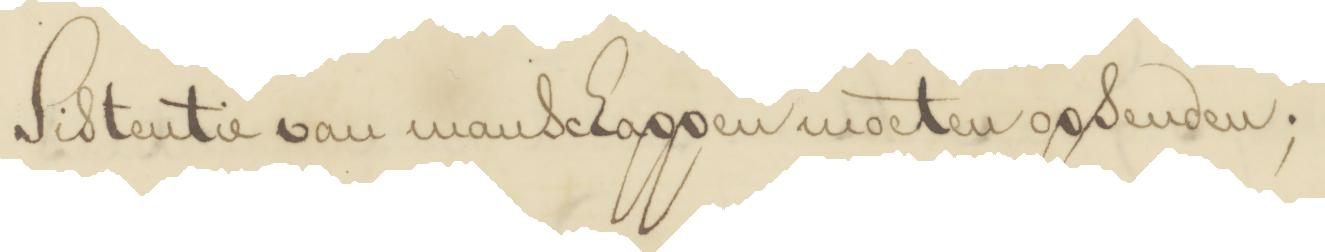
sistentie van manschappen moeten opsenden;
